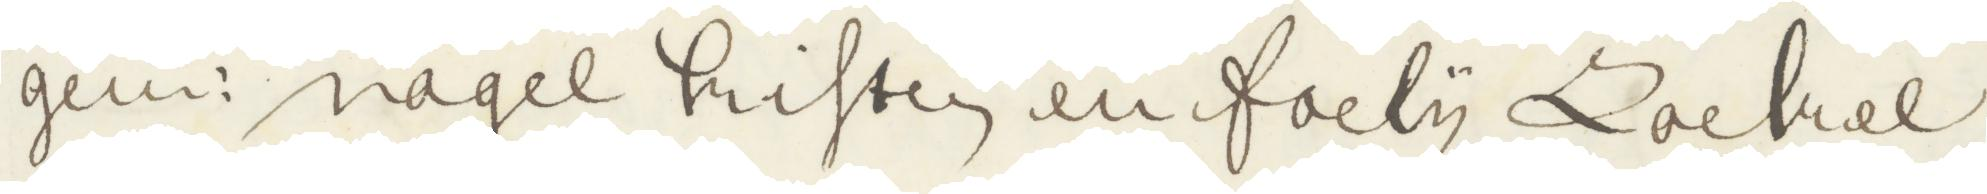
gem: nagel kisten en foelij zoekel
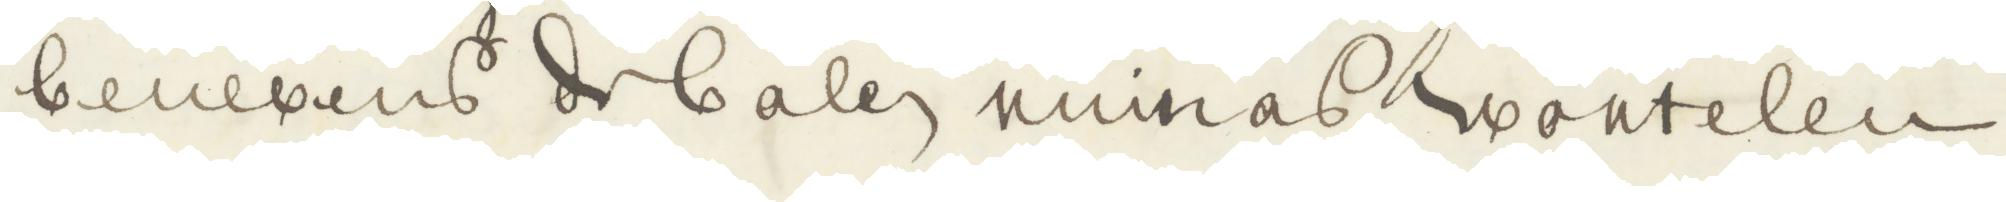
benevens de balen ruinas wortelen
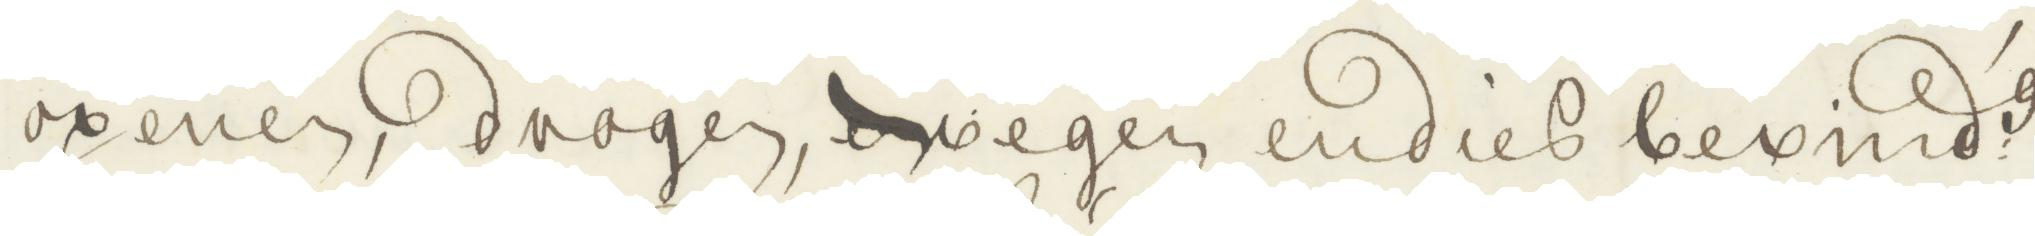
openen, drogen, wegen en dies bevind:g
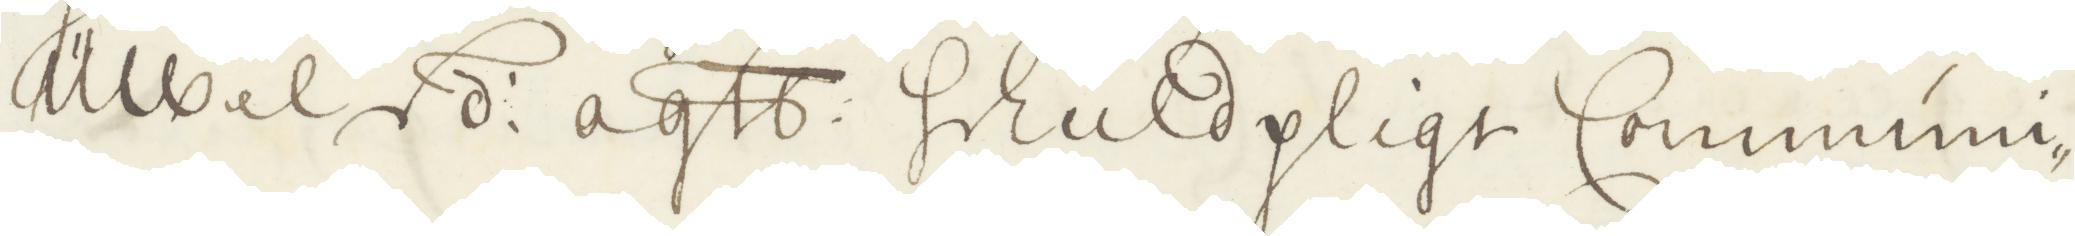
UWel Ed: agtb: schuldpligt Communi„
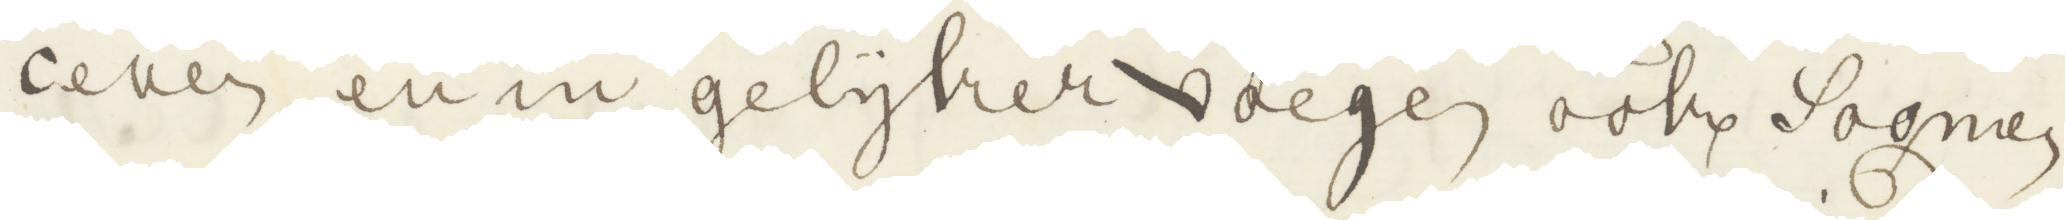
ceren en in gelijker voegen ook soo men
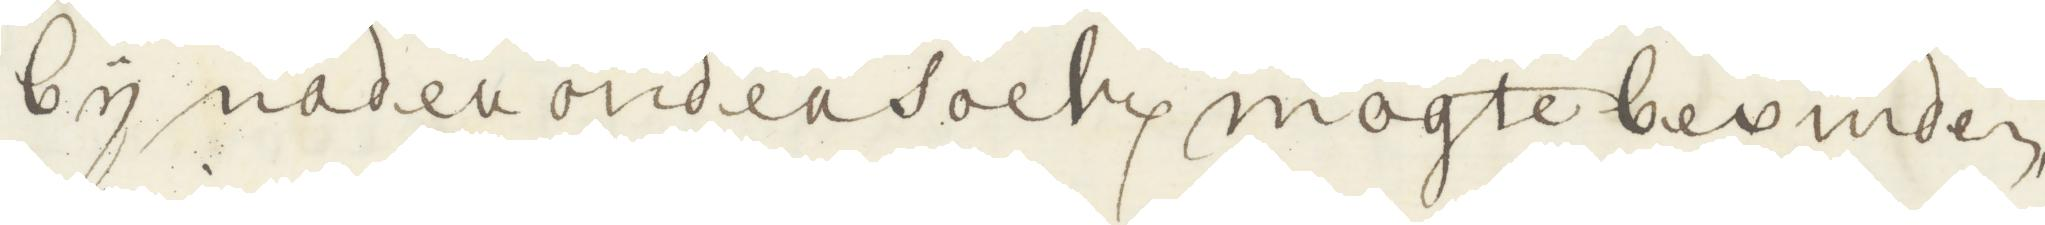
bij nader ondersoek mogte bevinden,
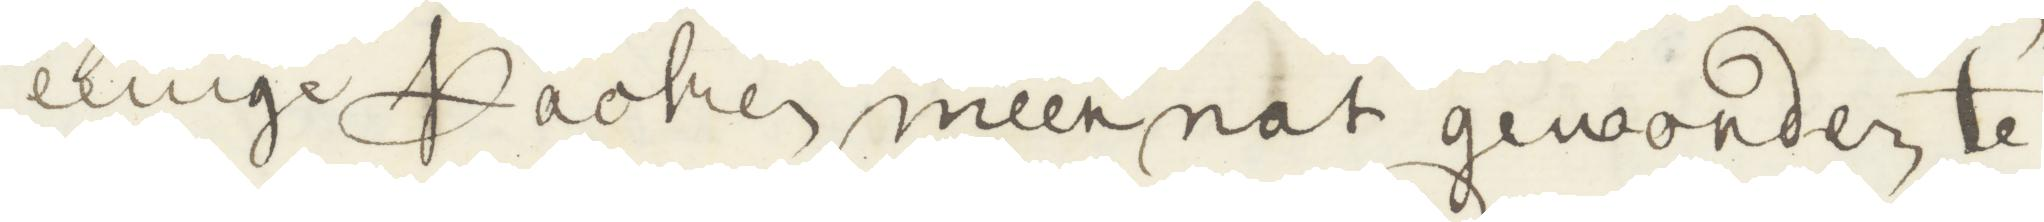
eenige Packen meer nat geworden te
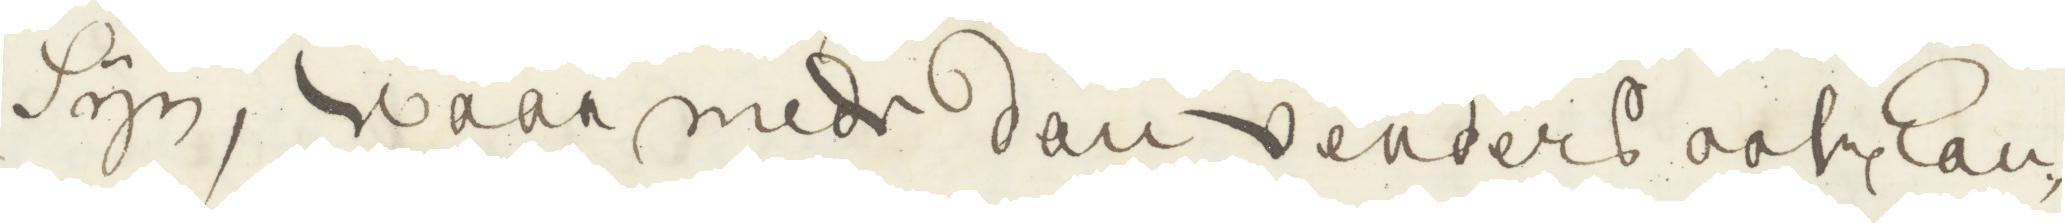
sijn, waar mede dan verders ook han„
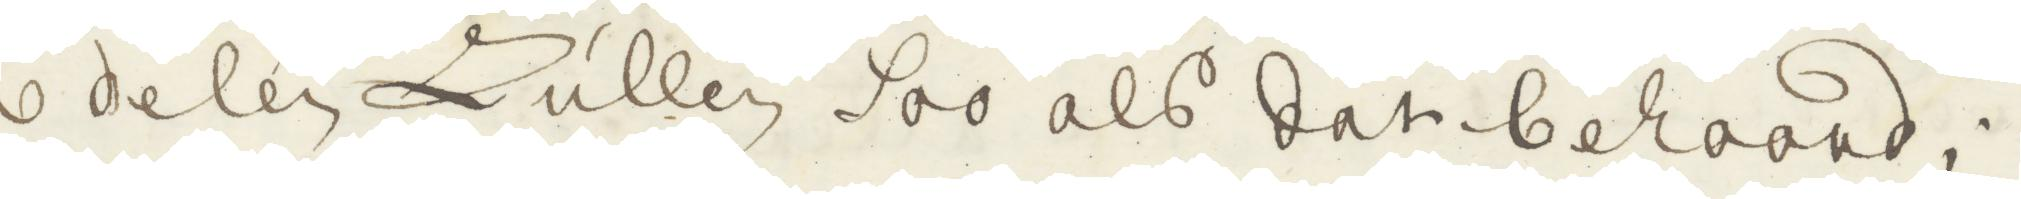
delen zullen soo als dat behoord;
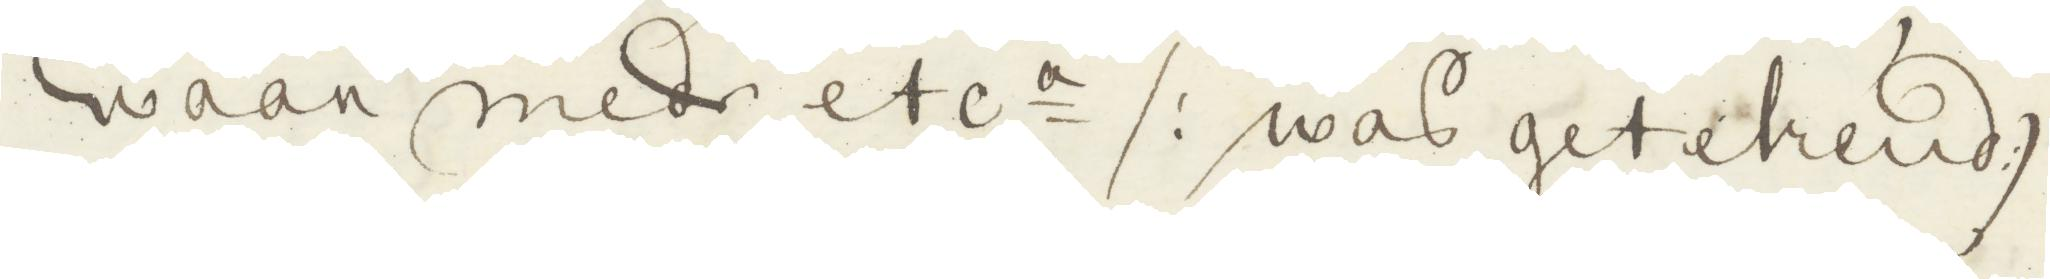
Waar mede etc=a /:was getekend:)
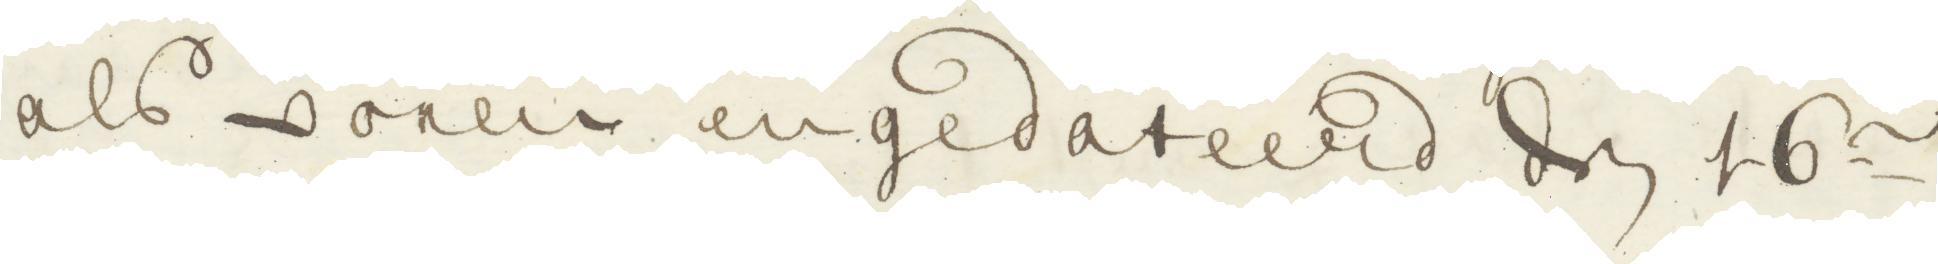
als voren en gedateerd den 16=e
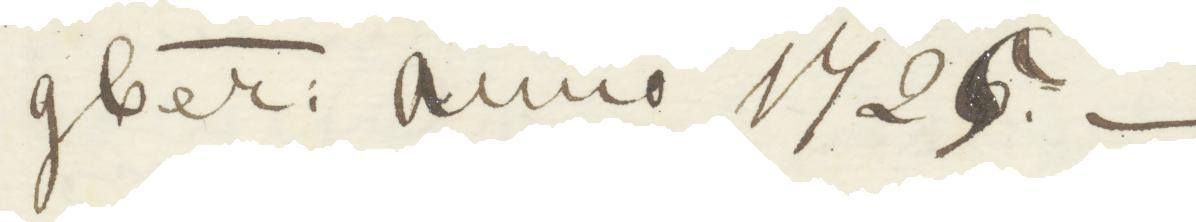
9ber: Anno 1725.
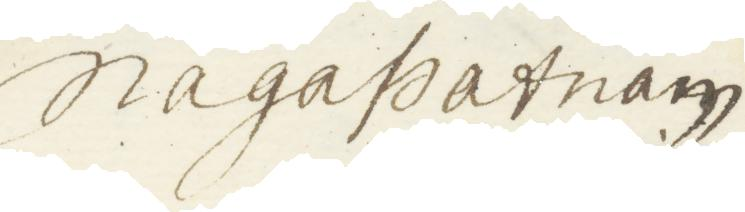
nagapatnam
